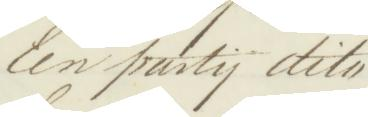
Een partij dito
